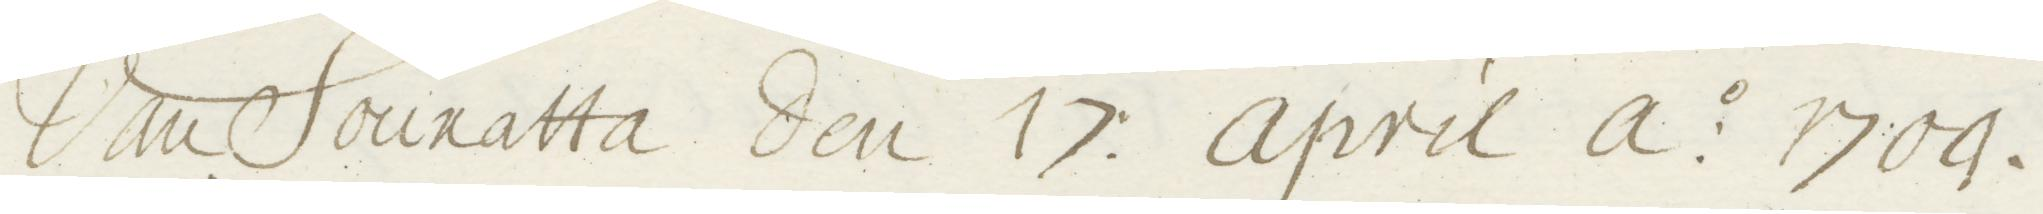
Van Souratta den 17: april a:o 1704.
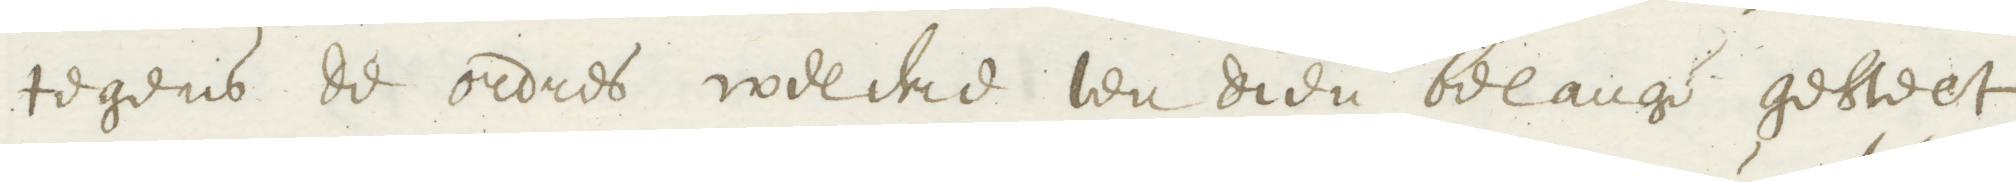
tegens de ordres welcke ten dien belange gestelt
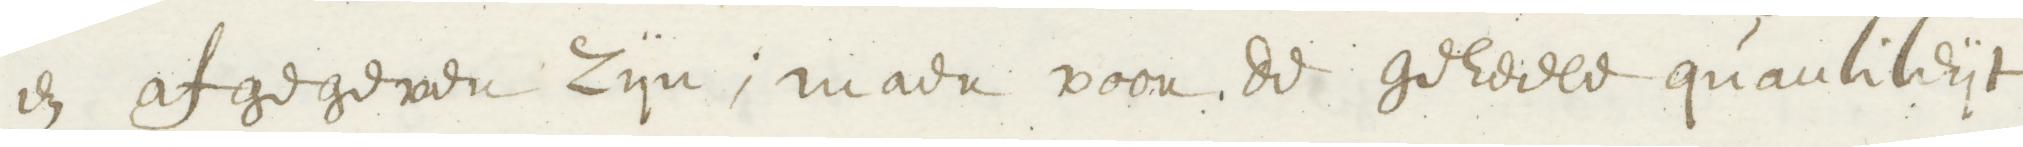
en afgegeven zijn; maer voor de geheele quantiteijt
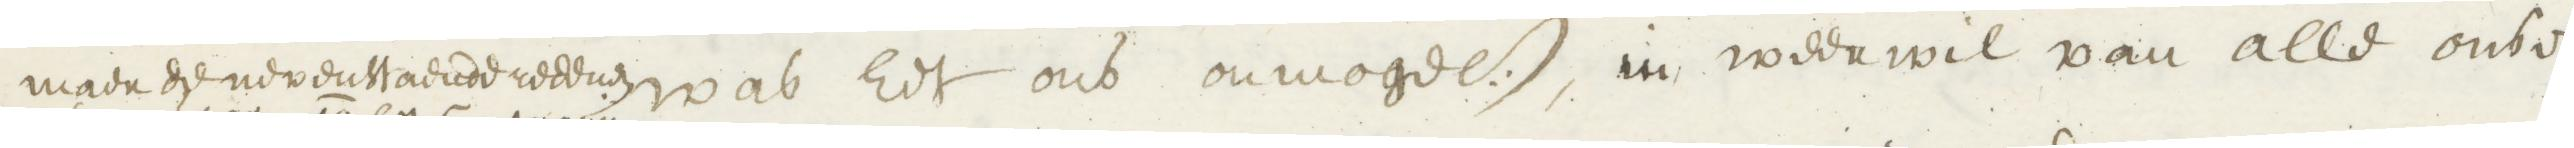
maer de nevenstaende redenen was het ons onmogelijk, in weerwil van alle onse
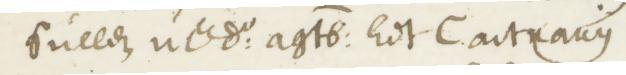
sullen u Ed:e agtb: het Contrarij
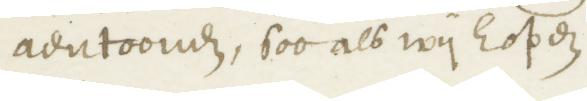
aentoonen, soo als wij hopen
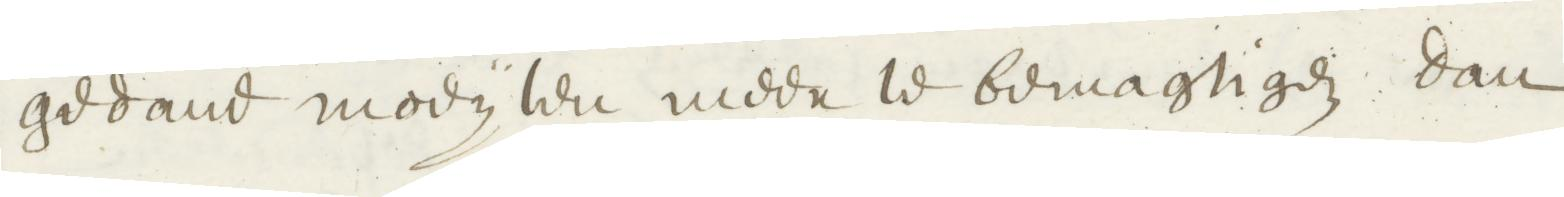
gedane moeijten meer te bemagtigen dan
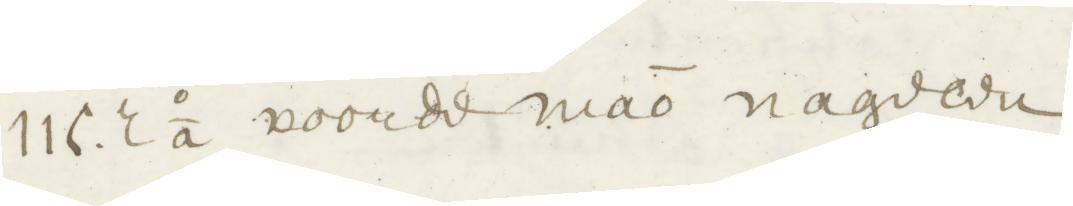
115. ro/a voor de maō nagelen
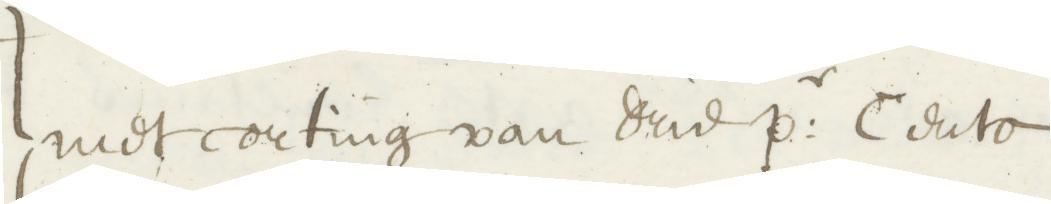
met corting van drie p:r Cento
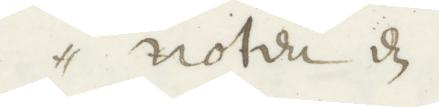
„ noten en
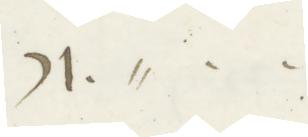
31. „ - -
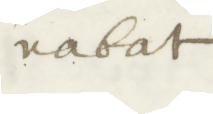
rabat
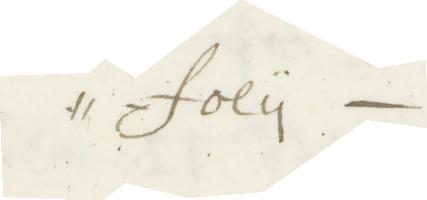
„ folij —
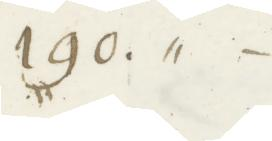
190. „ -
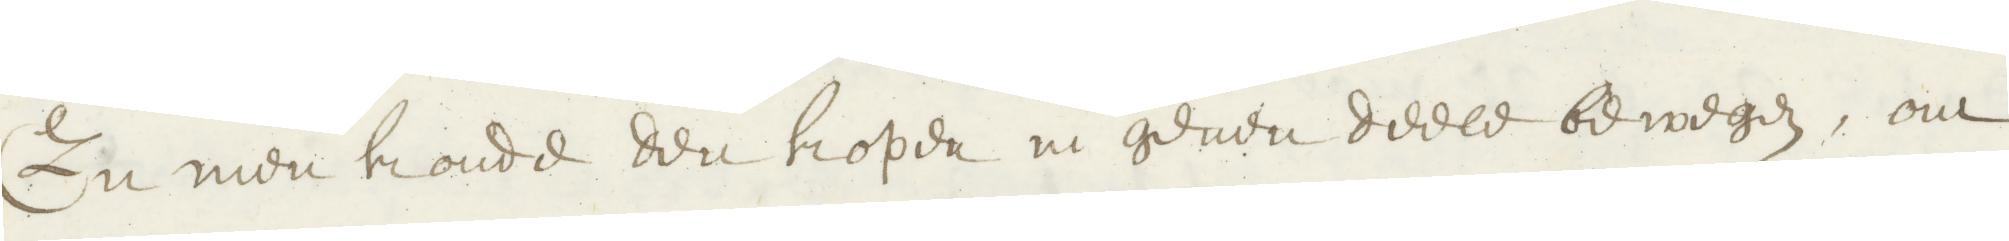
En men konde den koper in genen deele bewegen, om
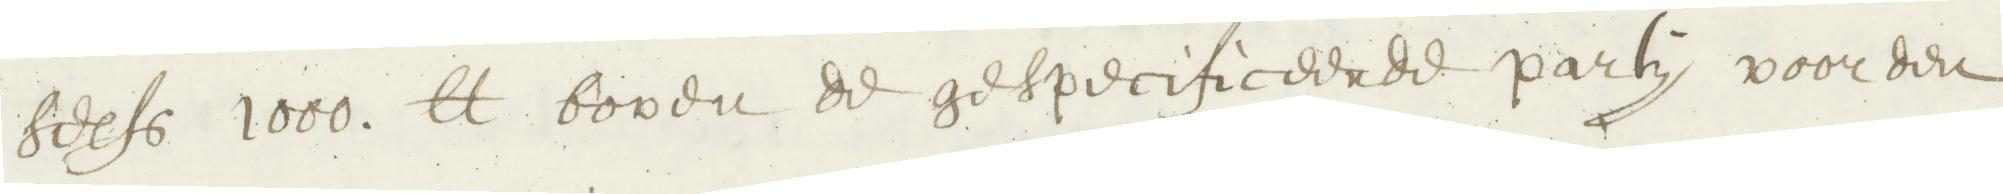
selfs 1000. lb boven de gespecificeerde partij voor den
